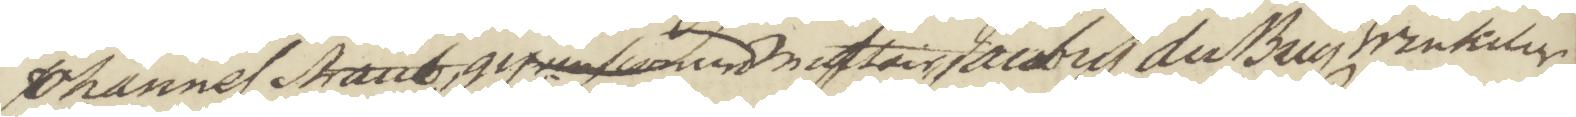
Johannes Straub, gepensioneerd militair, Jacobus du Buy Winkelier,
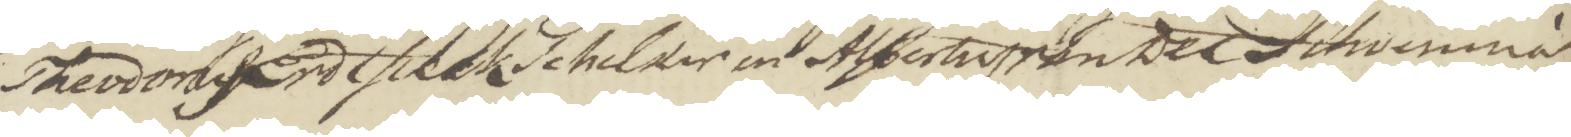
Theodorus Erdtsieck schilder en Albertus van Det schoenma
